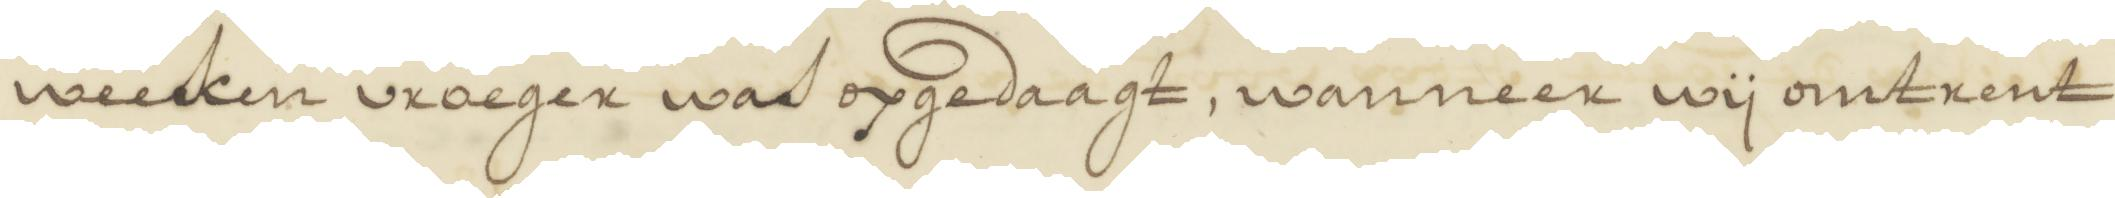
weeken vroeger was opgedaagt, wanneer wij omtrent
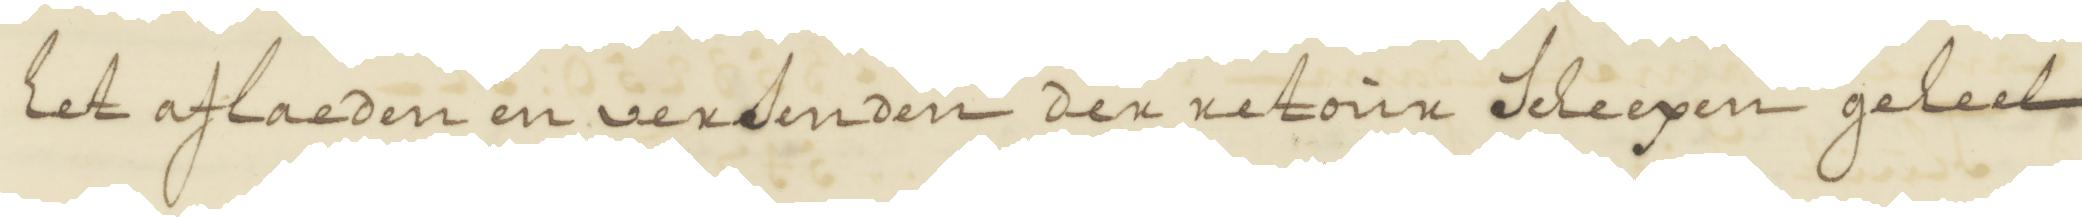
het aflaeden en versenden der retour scheepen geheel
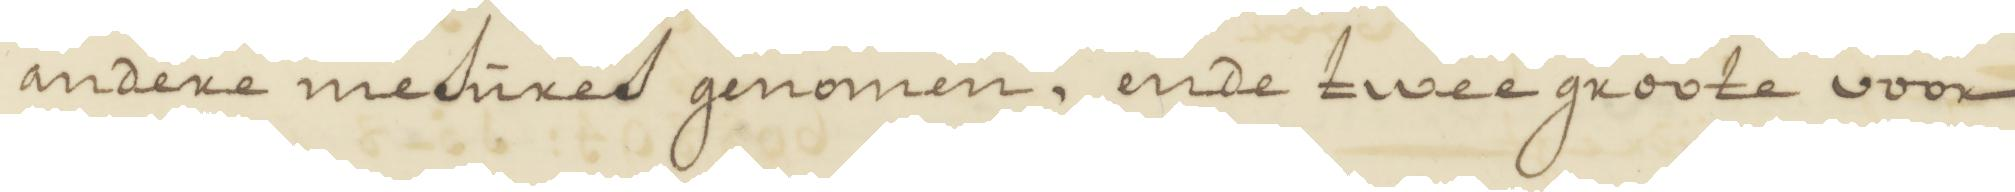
andere mesures genomen, ende twee groote voor
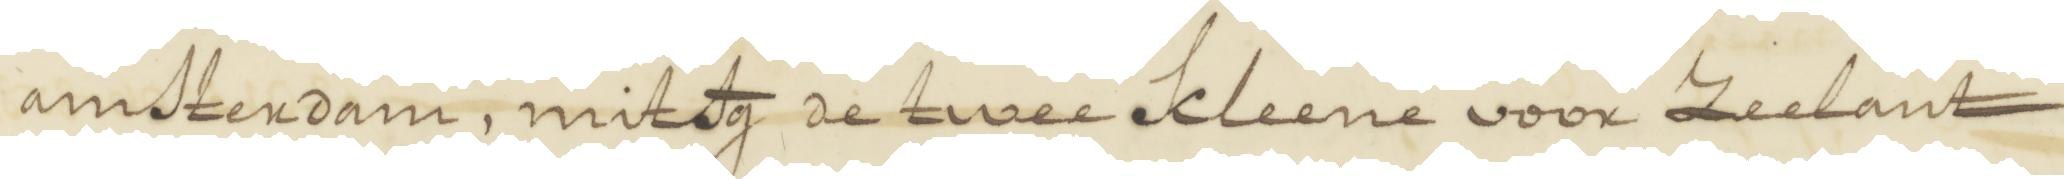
amsterdam, mitsg de twee kleene voor zeelant
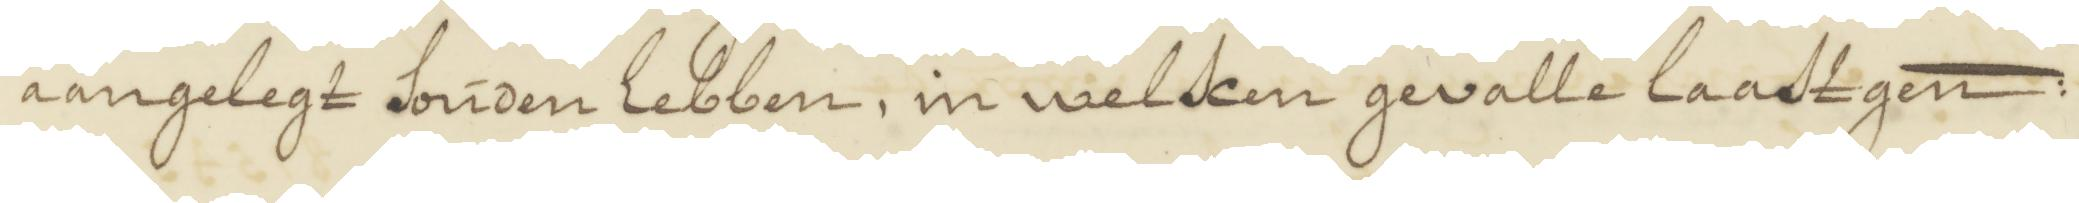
aangelegt souden hebben, in welken gevalle laast gen:
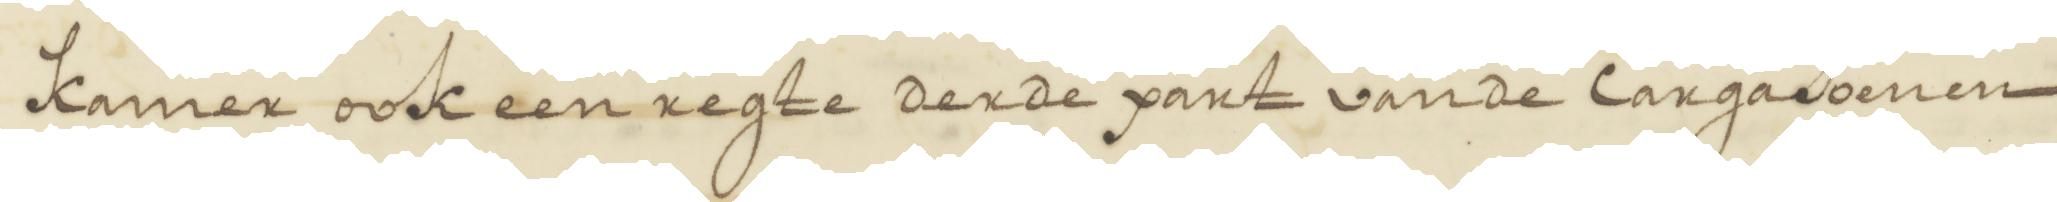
kamer ook een regte derde part van de Cargasoenen
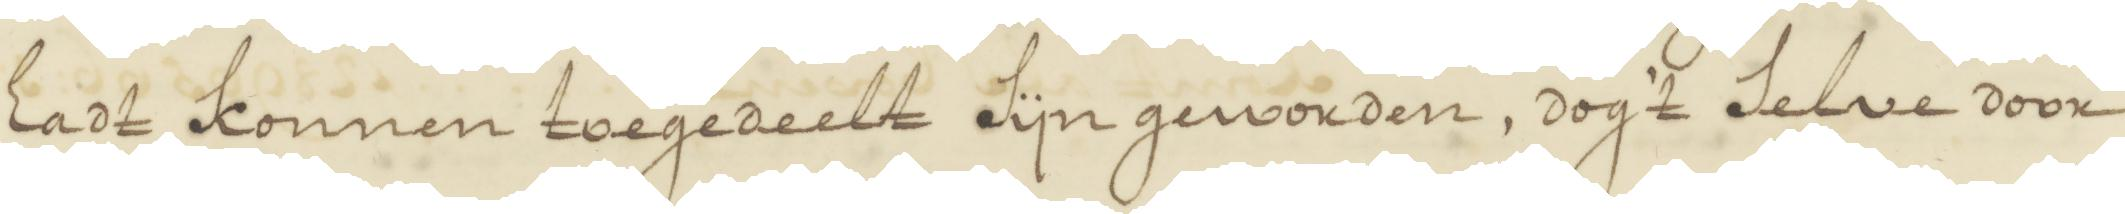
hadt konnen toegedeelt sijn geworden, dog ’t selve door
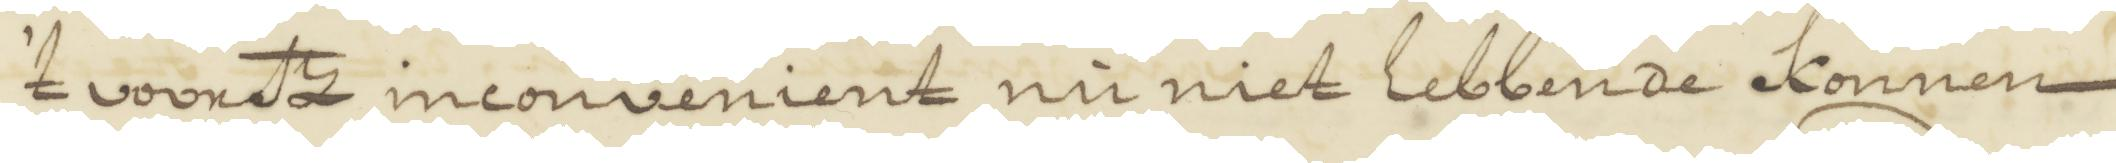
’t voorsz inconvenient nu niet hebbende konnen
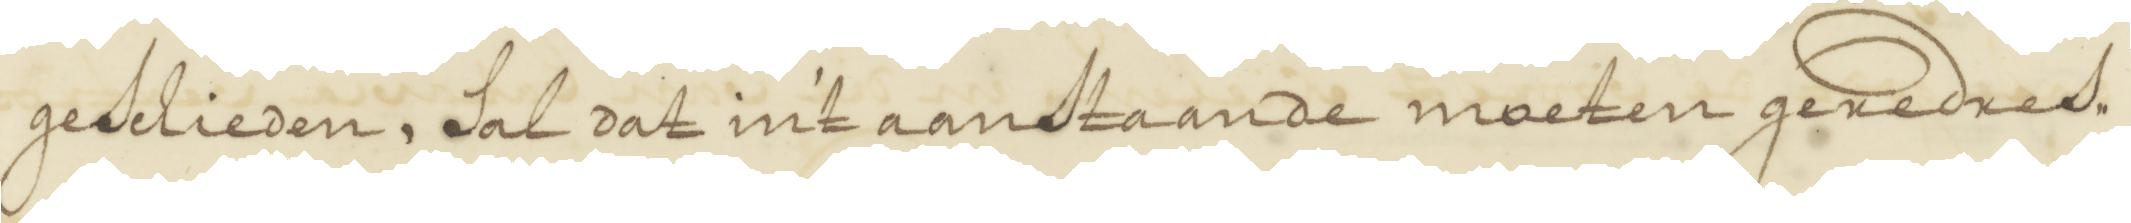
geschieden, sal dat in ’t aanstaande moeten geredres„
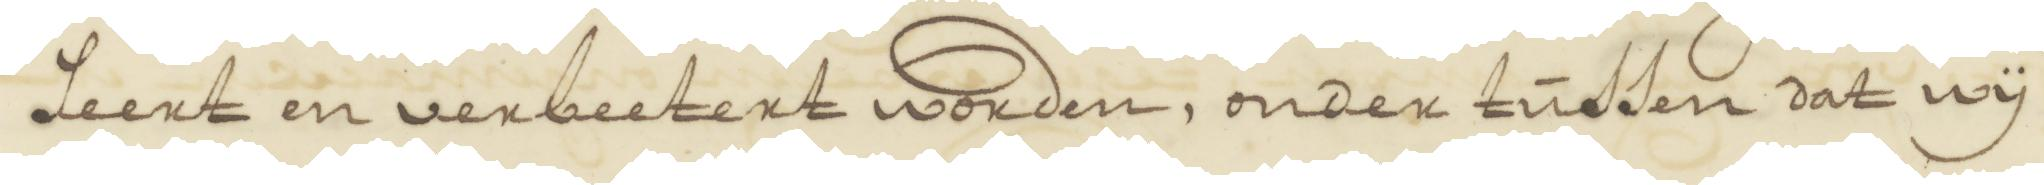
seert en verbeetert worden, onder tussen dat wij
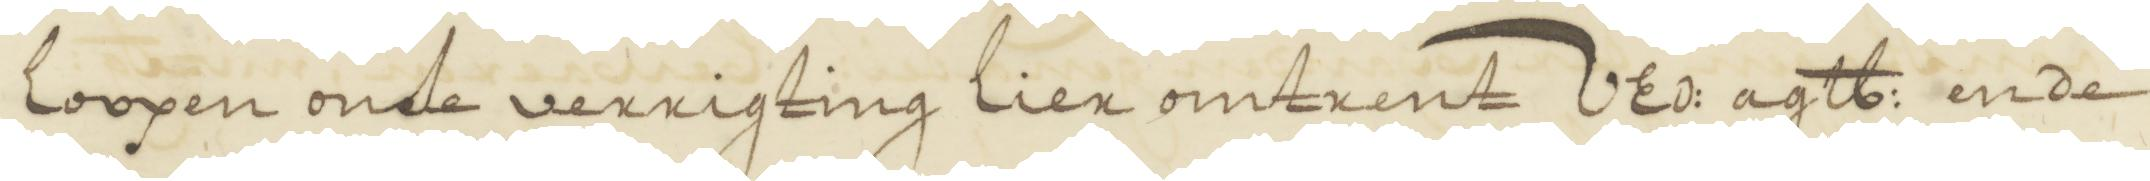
hoopen onse verrigting hier omtrent VEd: agtb: ende
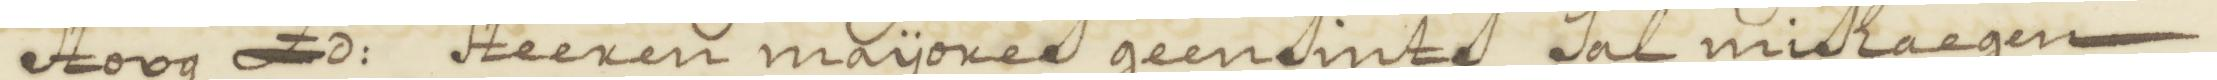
Hoog Ed: Heeren maijores geensints sal mishaegen
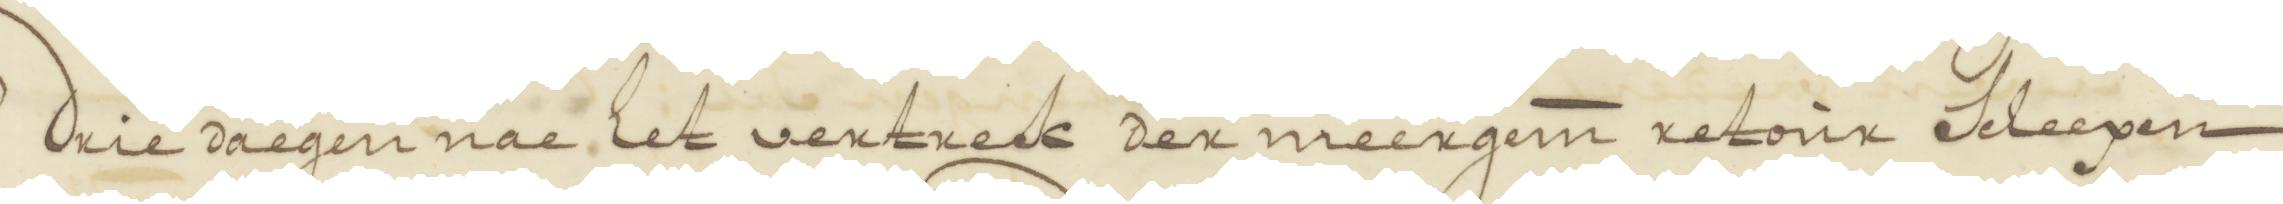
drie daegen nae het vertrek der meergem retour scheepen
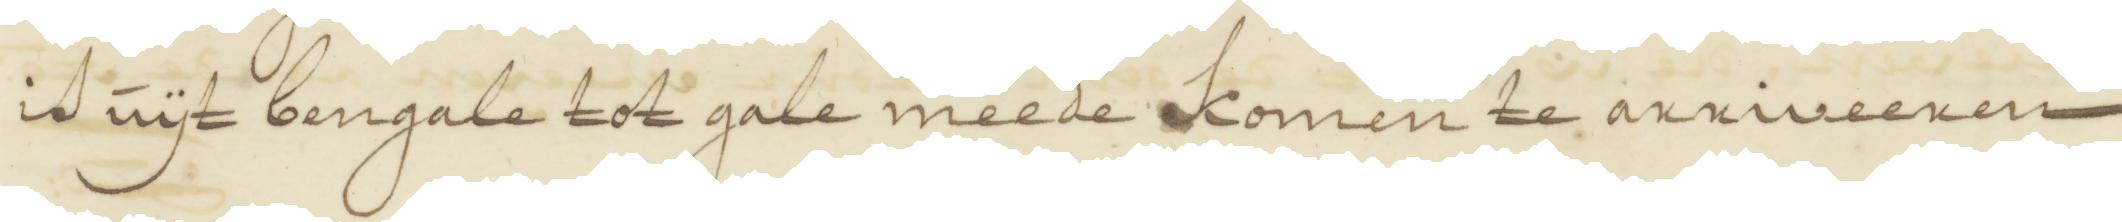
is uijt bengale tot gale meede komen te arriveeren
